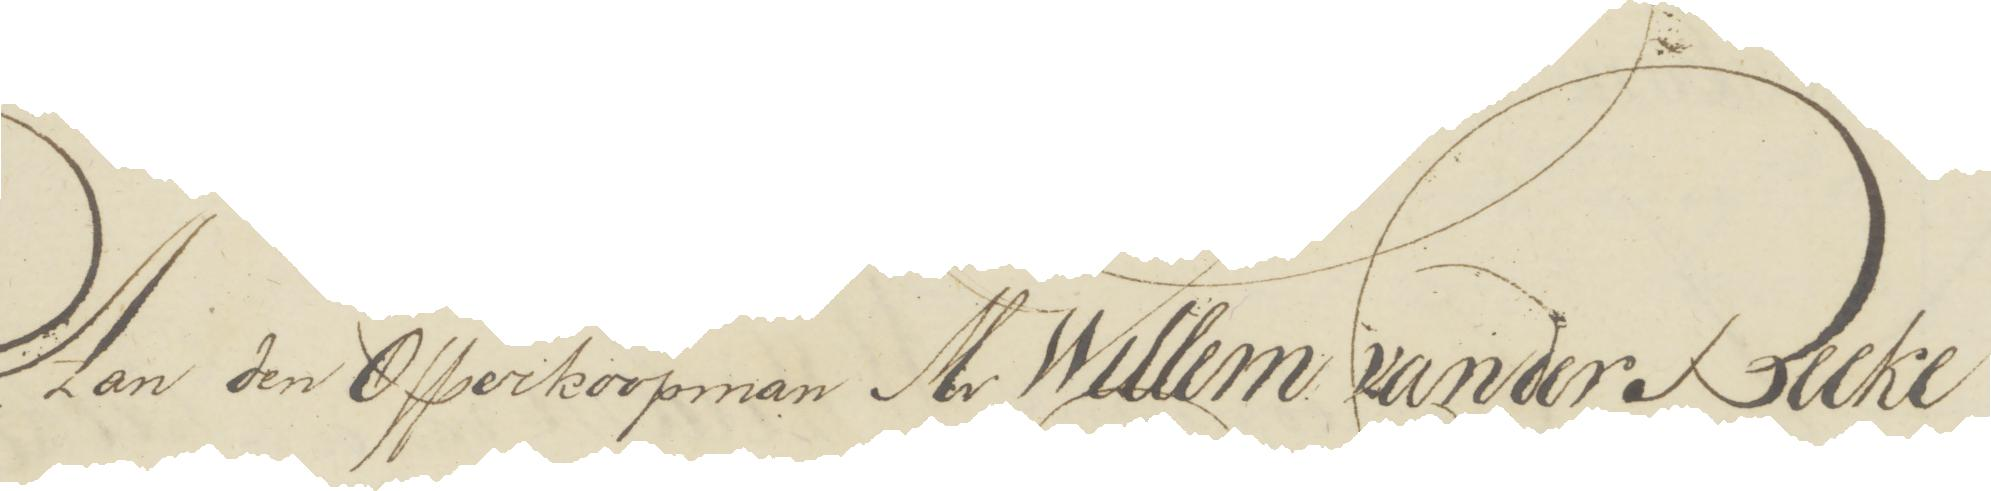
Van den Opperkoopman Mr Willem van der Beeke
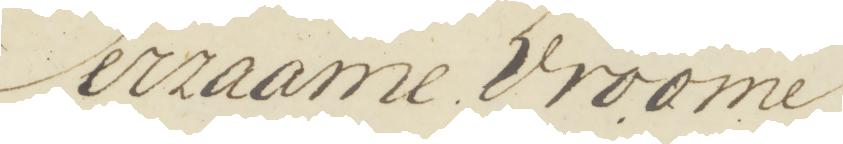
Eerzaame Vroome
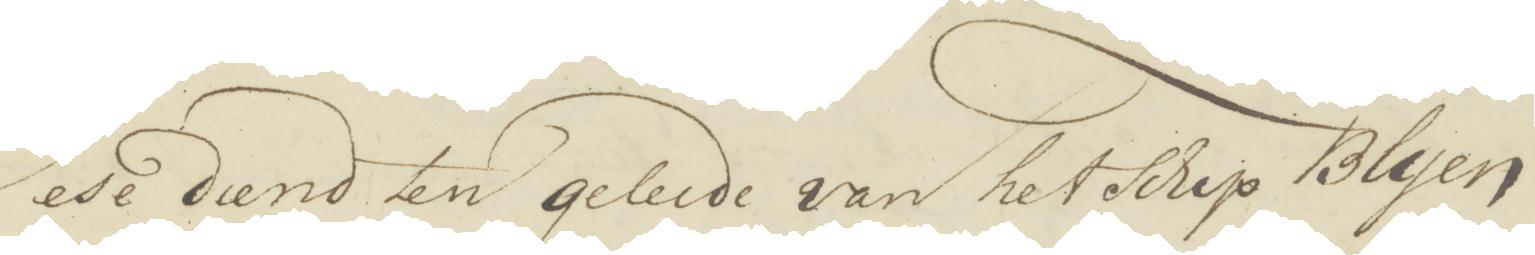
ese diend ten geleide van het schip Blyen
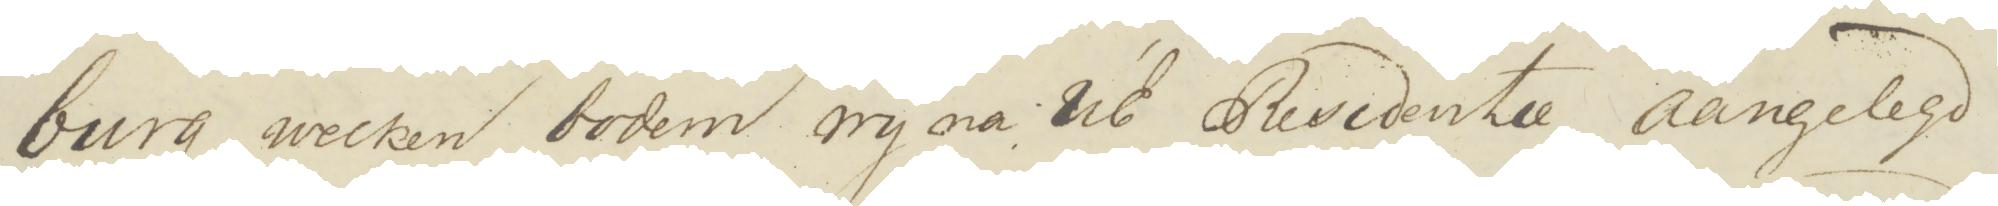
burg welken bodem wy na uE Residentie aangelegd
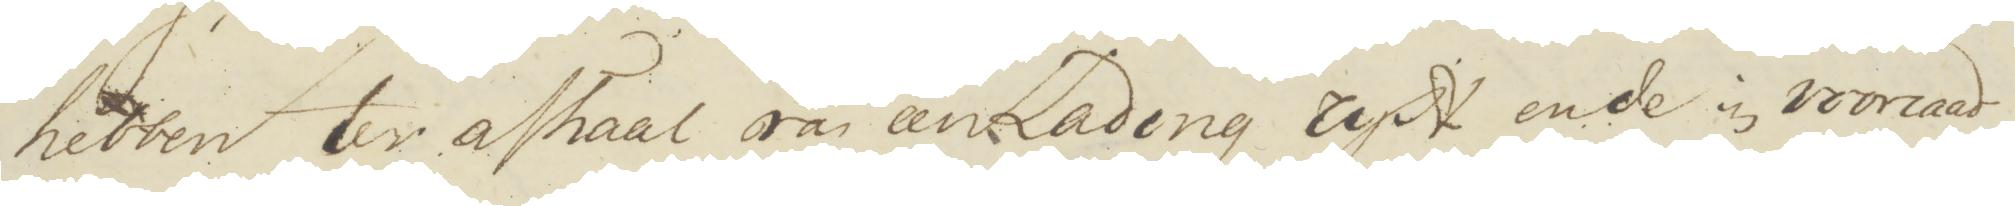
hebben ter afhaal van een Lading ryst ende in voorraad
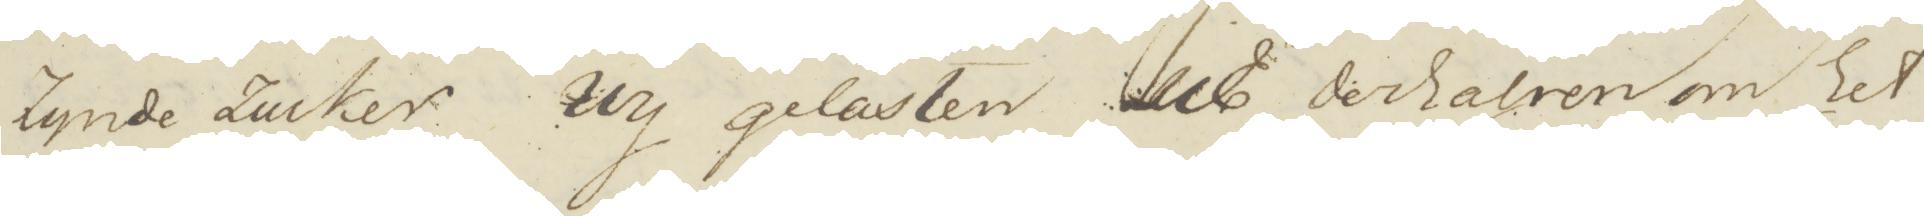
zynde zuiker wy gelasten uE derhalven om het
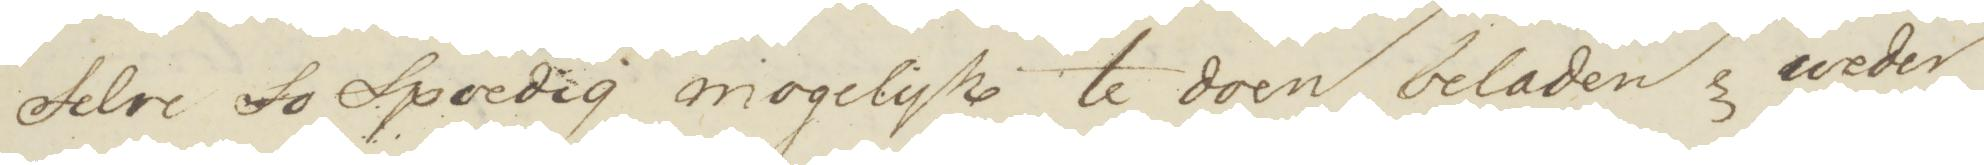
selve so spoedig mogelijk te doen beladen en weder
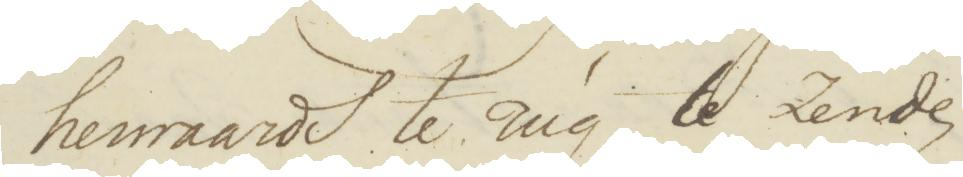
herwaards te rug te zenden
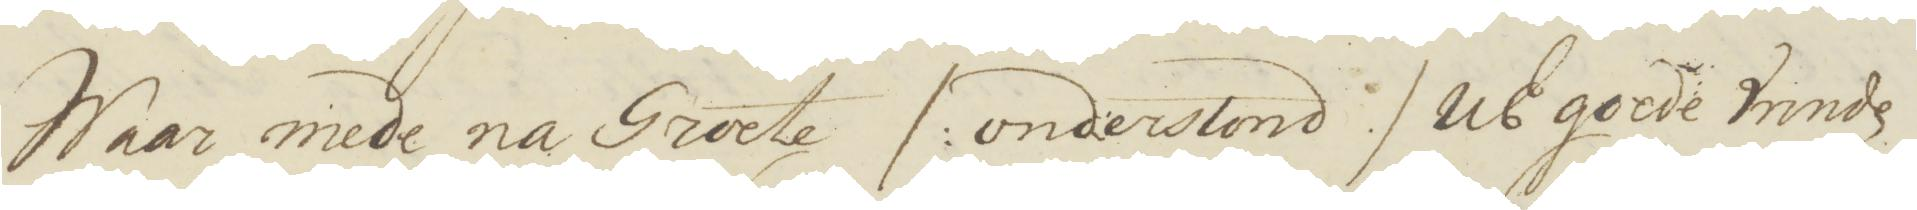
Waar mede na Groete /:onderstond:/ uE goede Vrinden
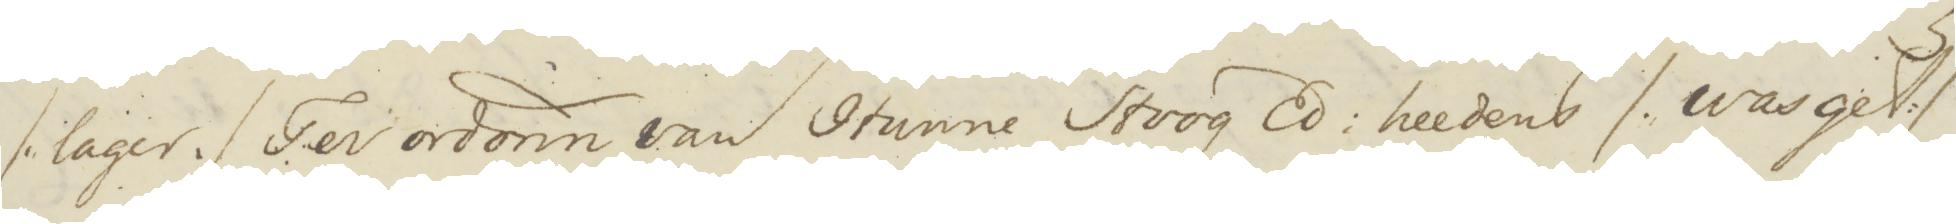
/:lager.:/ Ter ordonn van Hunne Hoog Ed: heedens /:was get:/
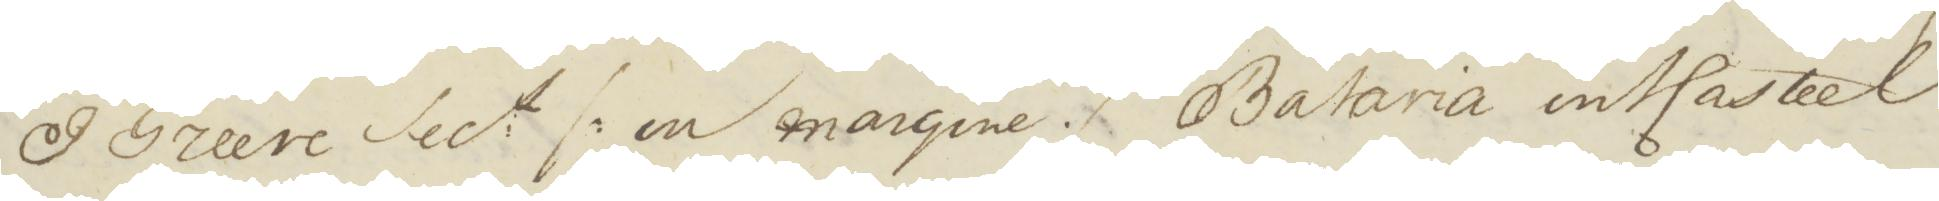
J Greeve Sec:t /: in margine:/ Batavia intCasteel
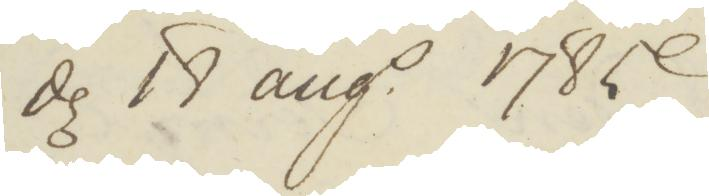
den 18 aug.s 1785
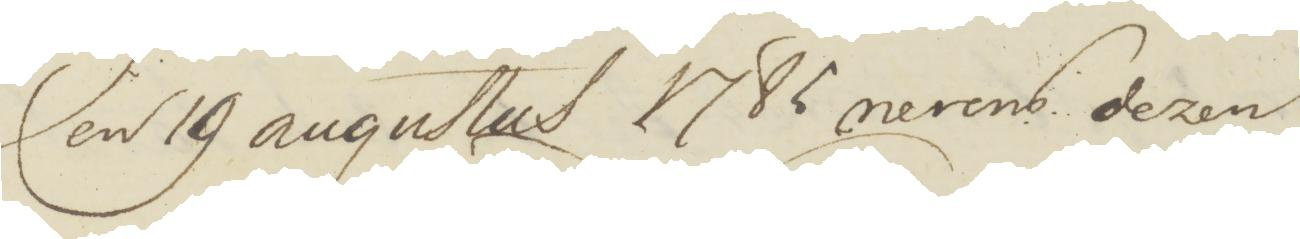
en 19 augustus 1785 nevens dezen
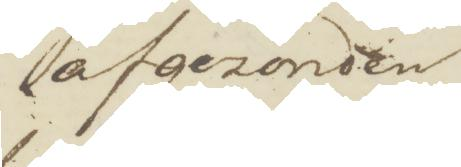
afgezonden
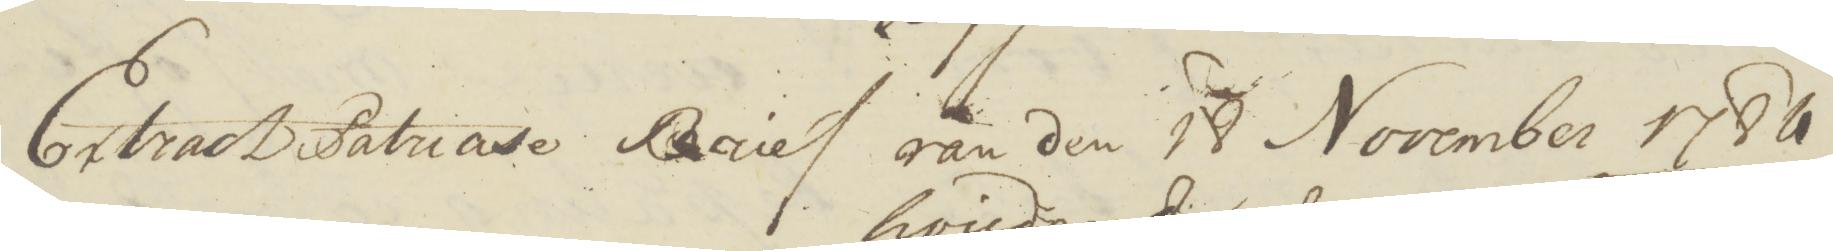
Extract Patriase Brief van den 18 November 1784
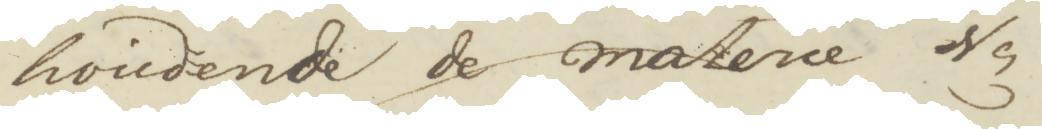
houdende de materie van
